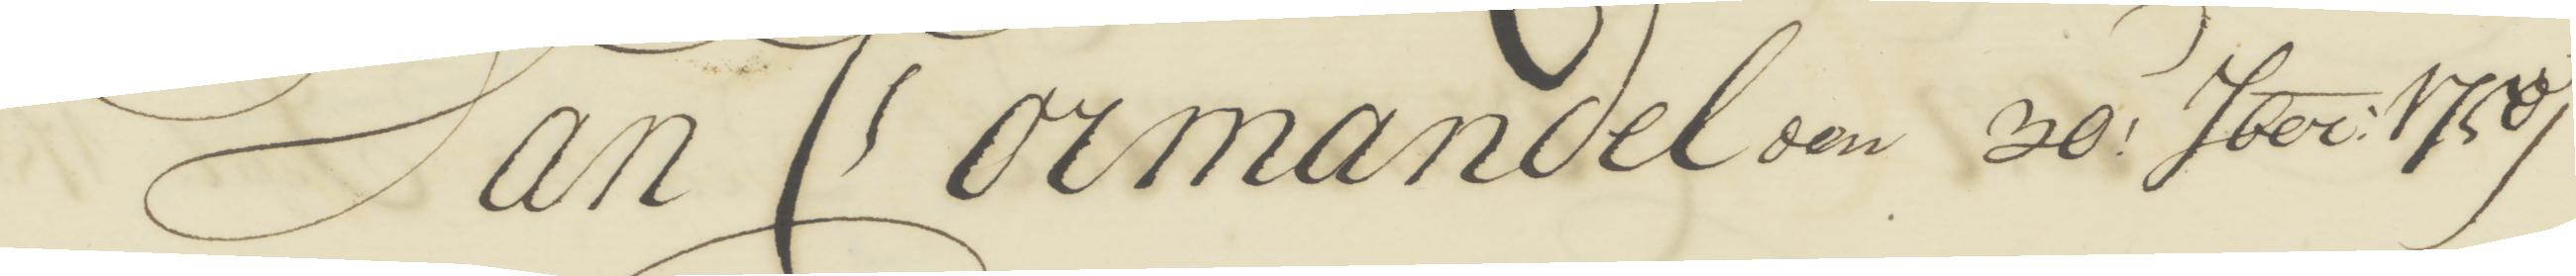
Van Cormandel den 30:' Jber: 1750,
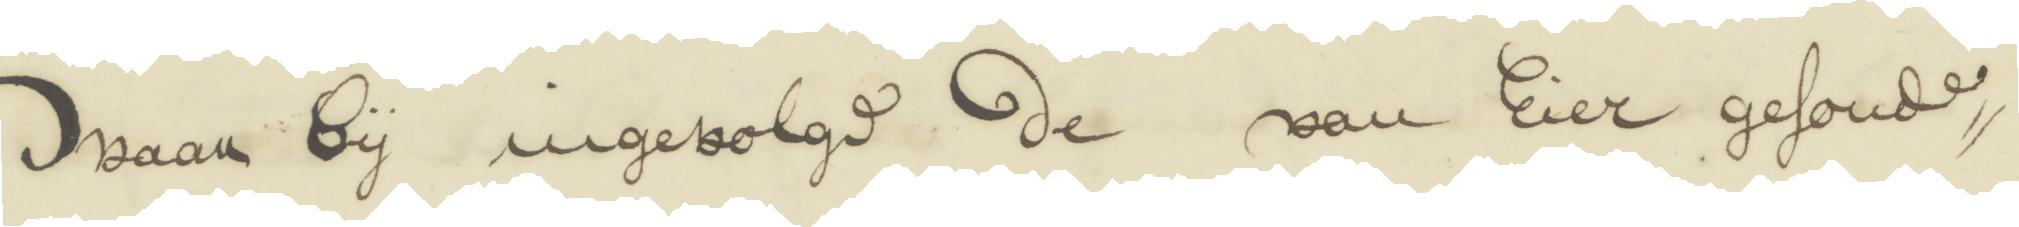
Waar bij ingevolge de van hier gesonde„
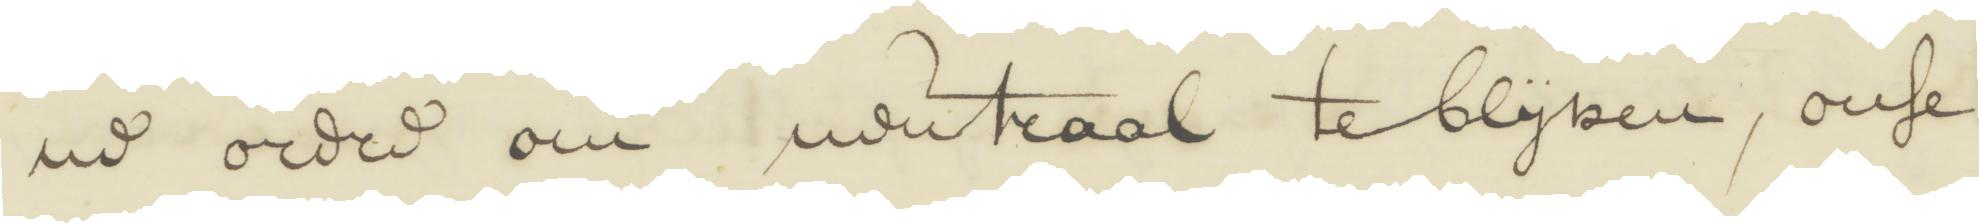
ne ordre om neutraal te blijven, onse
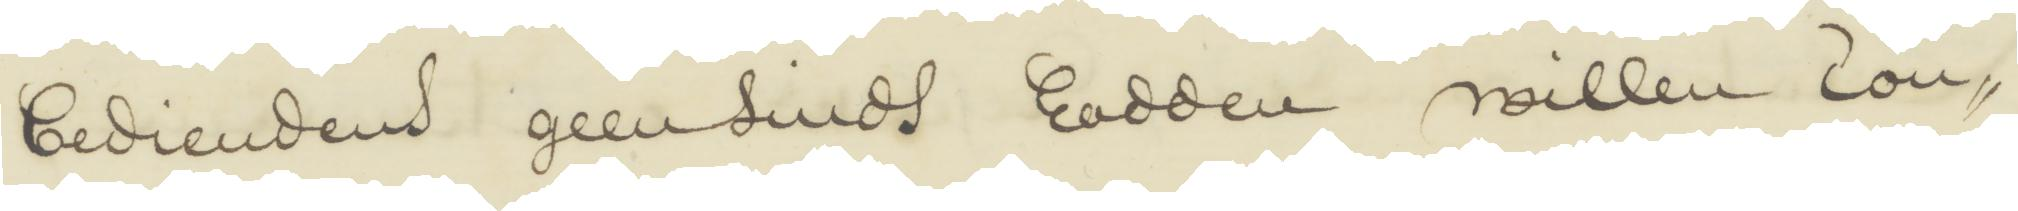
bediendens geensinds hadden willen con„
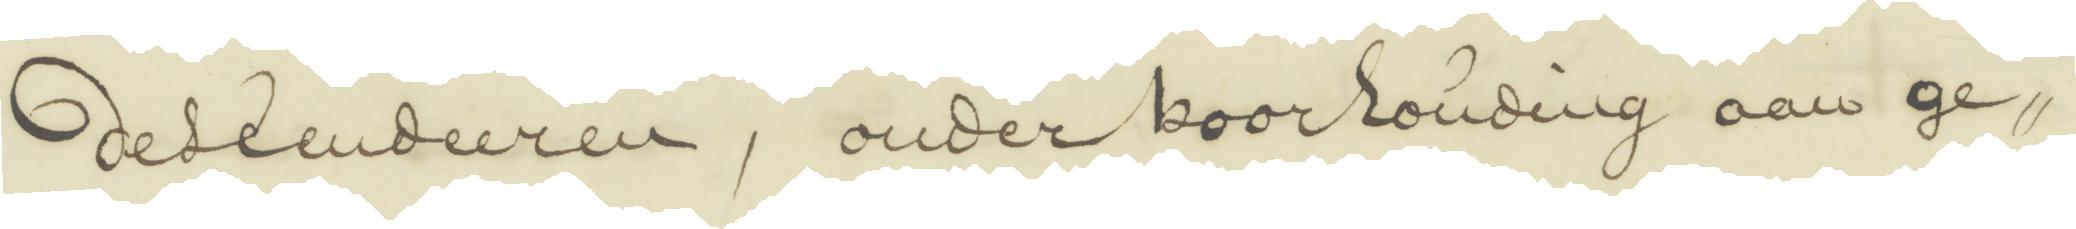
descendeeren, onder voorhouding aan ge„
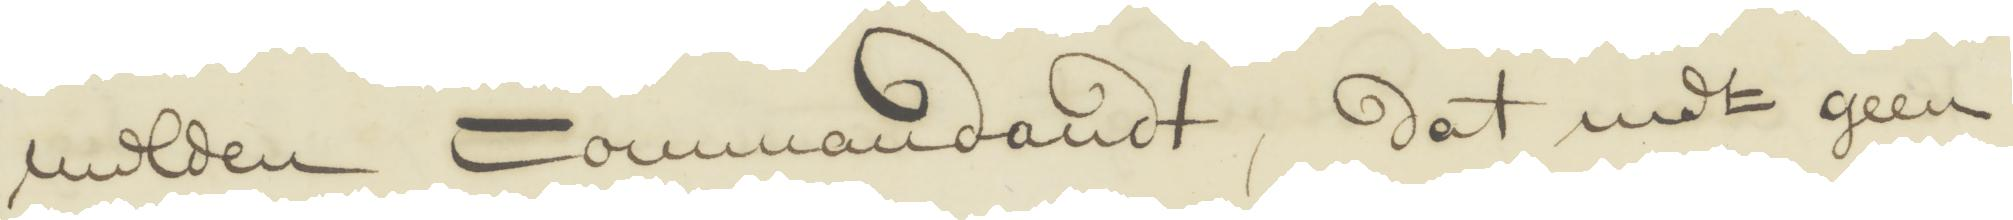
melden commandandt, dat met geen
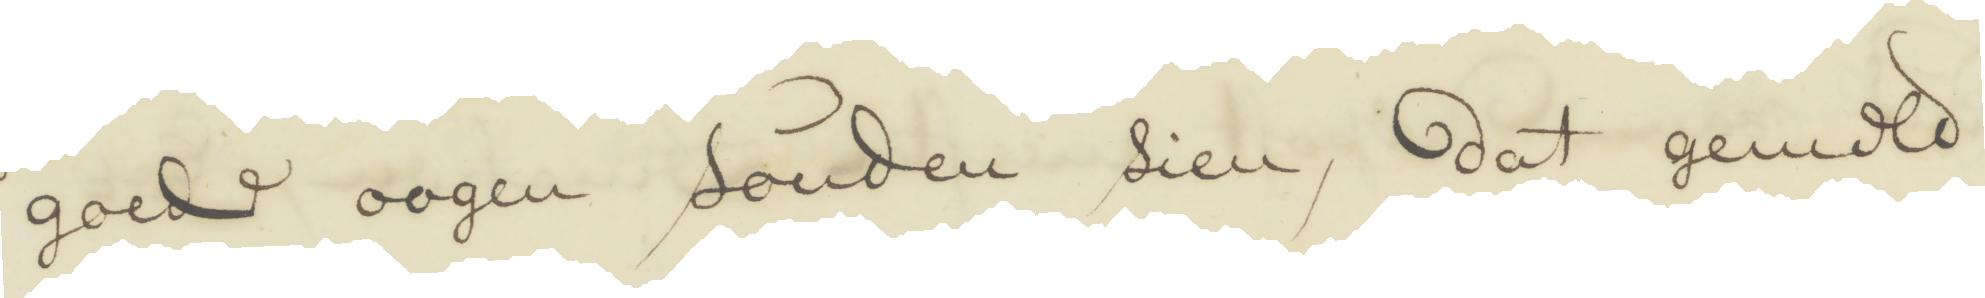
goede oogen souden sien, dat gemeld
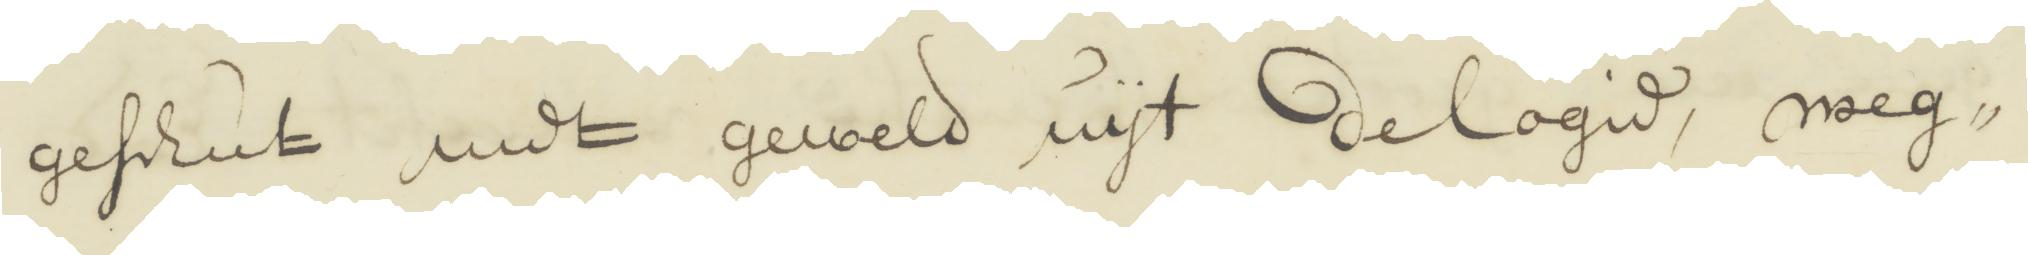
geschut met geweld uijt de logie, weg„
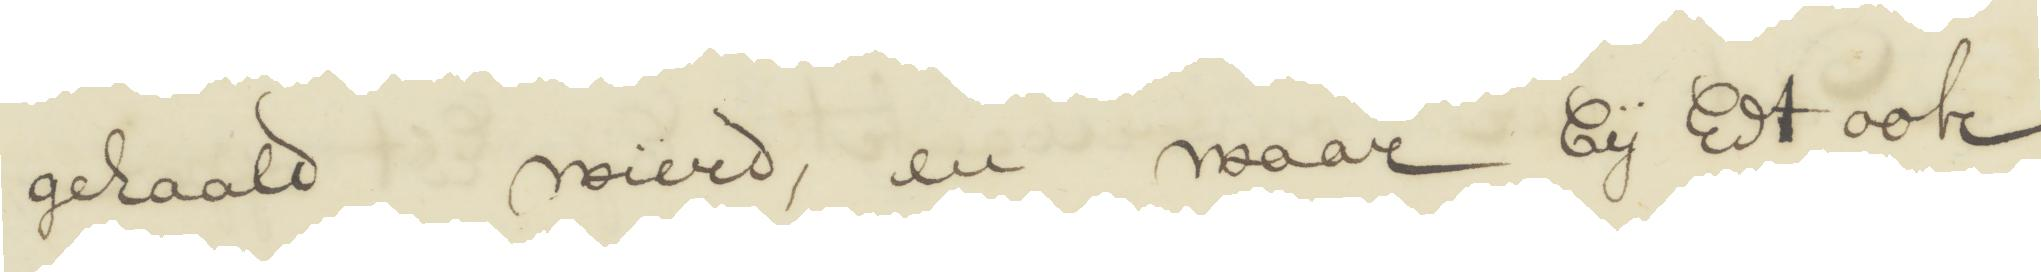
gehaald wierd, en waar bij het ook
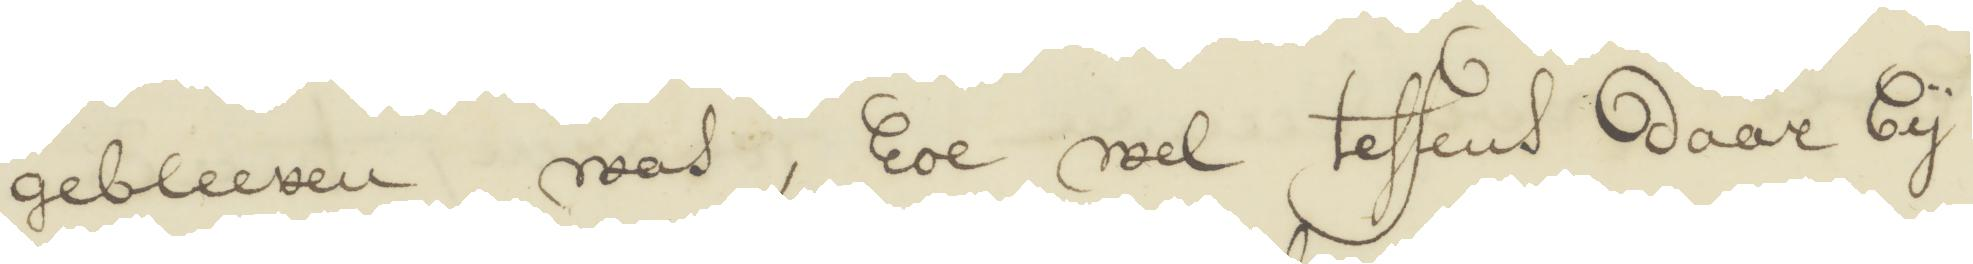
gebleeven was, hoe wel teffens daar bij
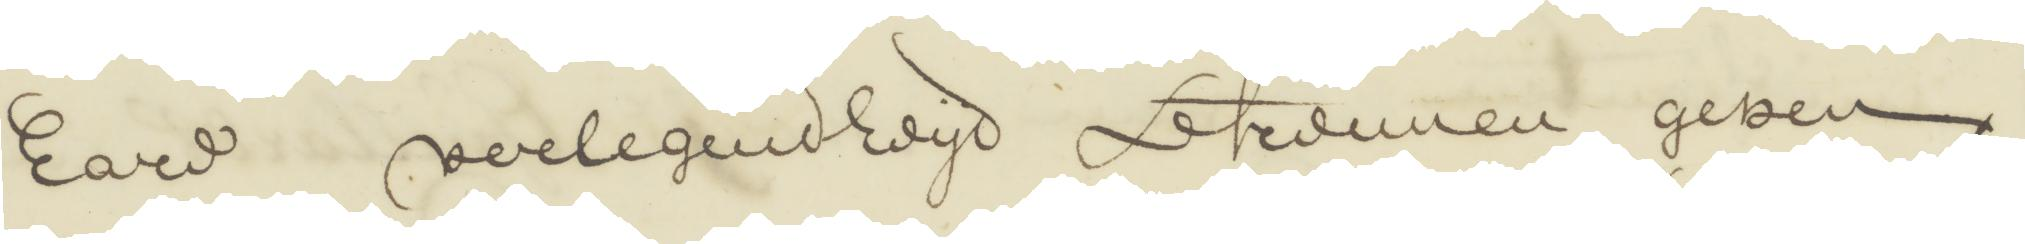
hare verlegendheijd tekennen geven,
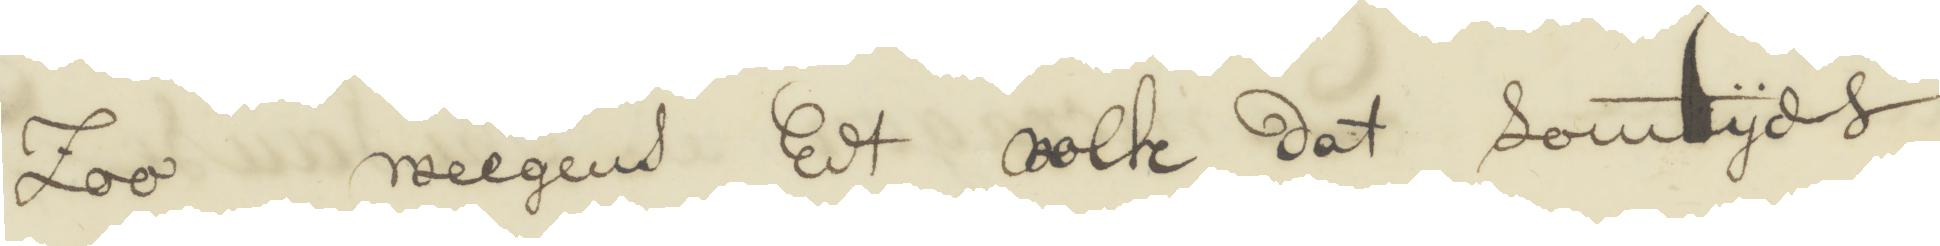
zoo weegens het volk dat somtijds
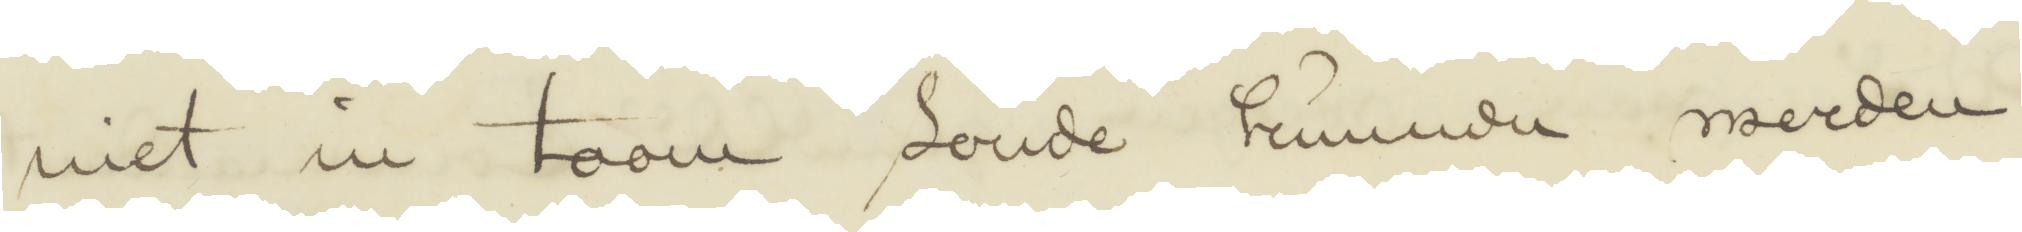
niet in toom soude kunnen werden
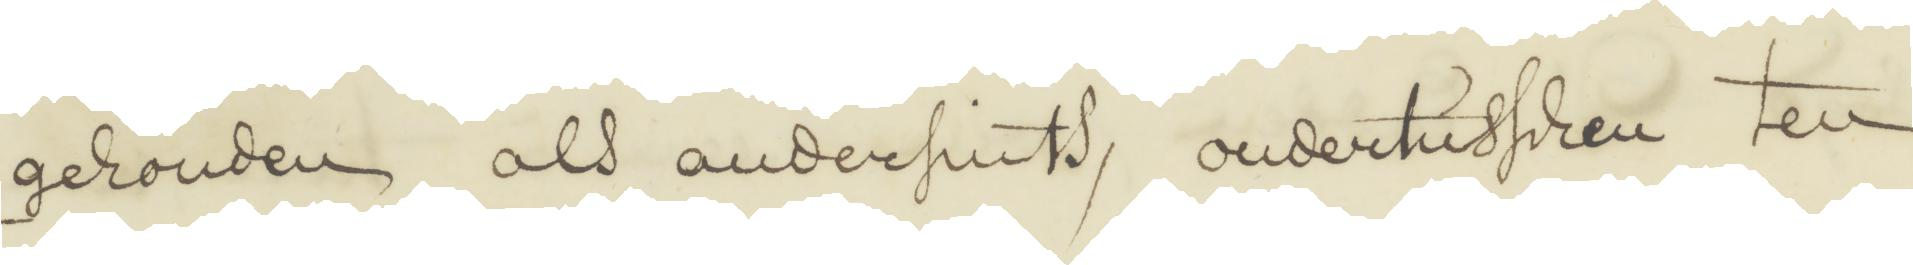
gehouden als andersints, ondertusschen ten
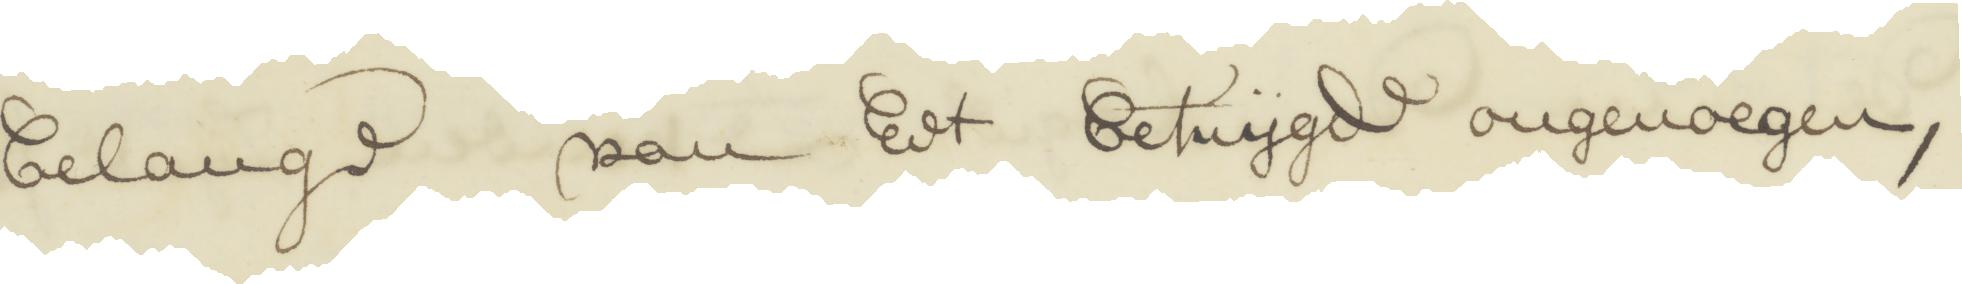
belange van het betuijgde ongenoegen,
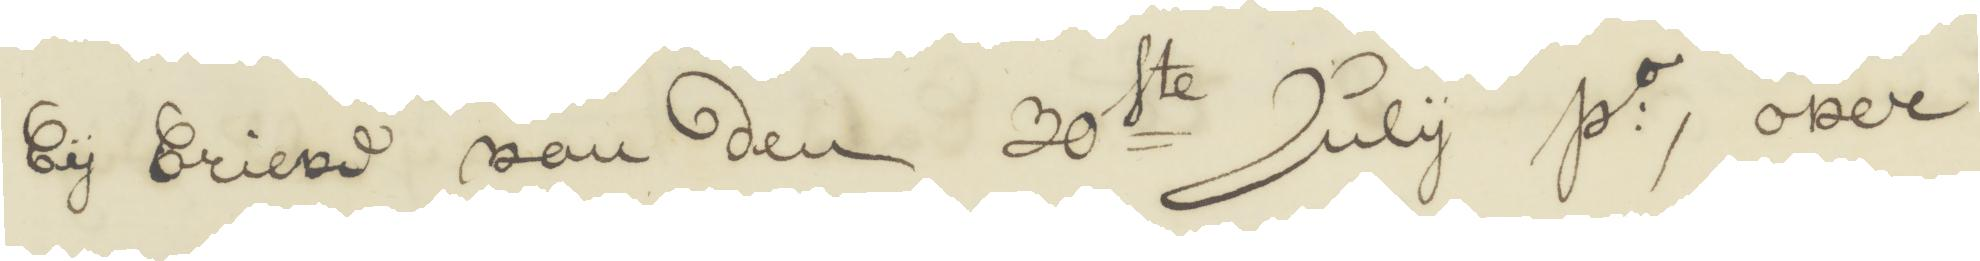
bij brieve van den 30=ste Julij p:o, over
